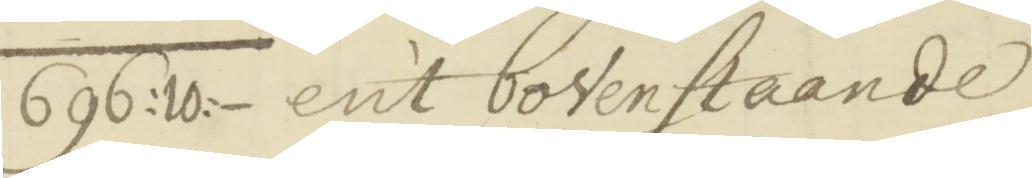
696:1- en't bovenstaande
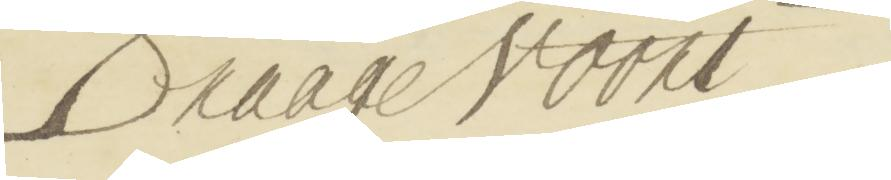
Draage voort
